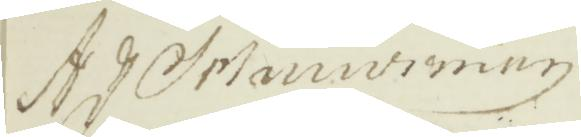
A J S Muurman
